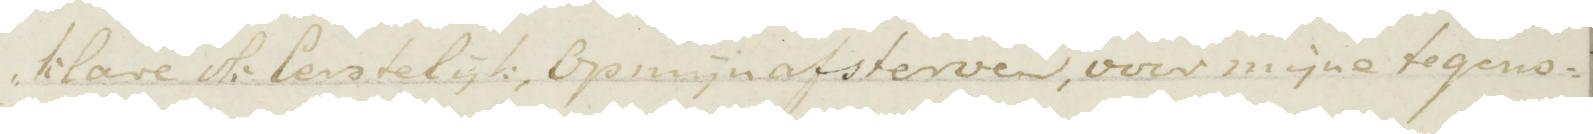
„klare ik Eerstelijk, Op mijn afsterven, voor mijne tegens=
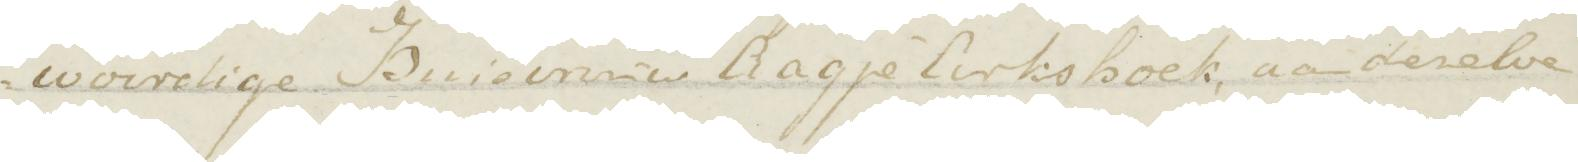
= woordige Huisvrouw Aagje Arkshoek, aan dezelve
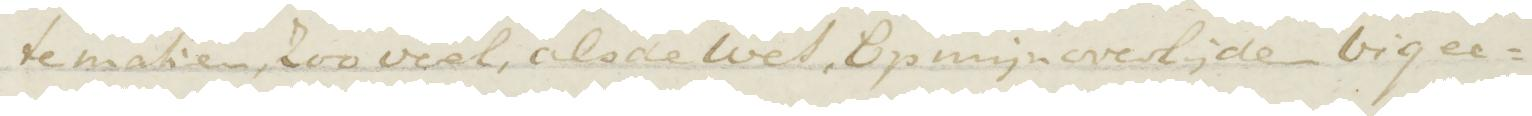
te maken, Zoo veel, als de wet, Op mijn overlijde vigee=
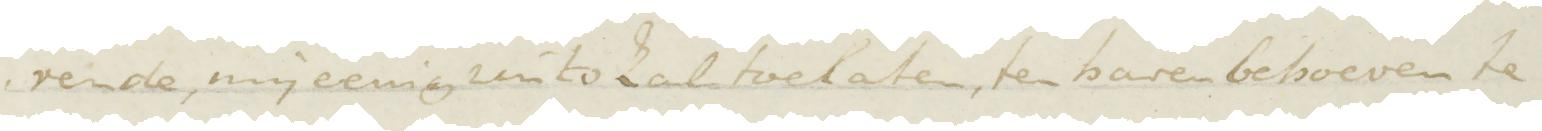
rende, mij eenig zints Zal toelaten, ten haren behoeven te
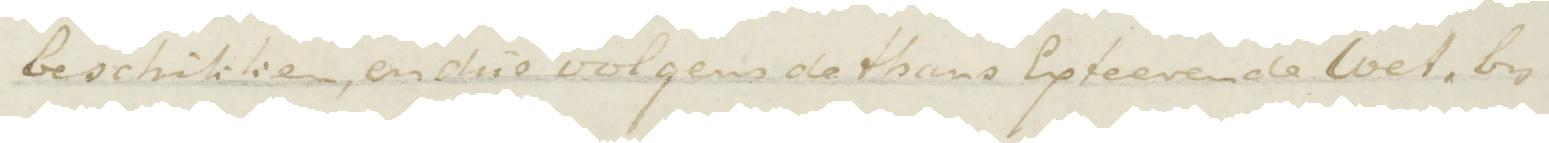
beschikken, en dus volgens de thans Exteerende wet, bij
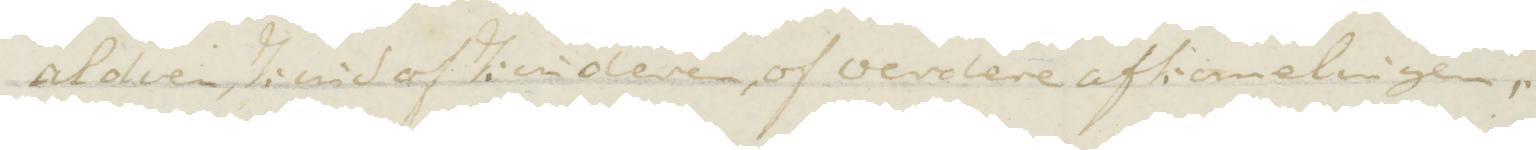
aldien, kind of kinderen, of verdere afkomelingen,.
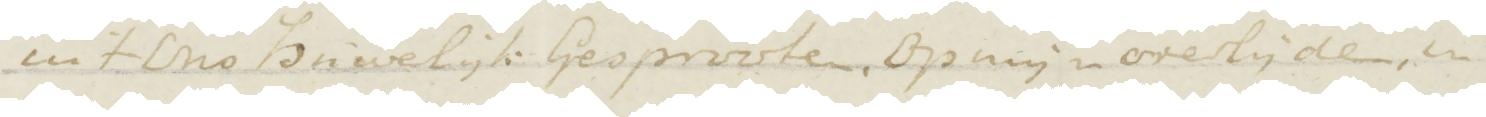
uit ons huwelijk Gesprooten, Op mijn overlijden, in
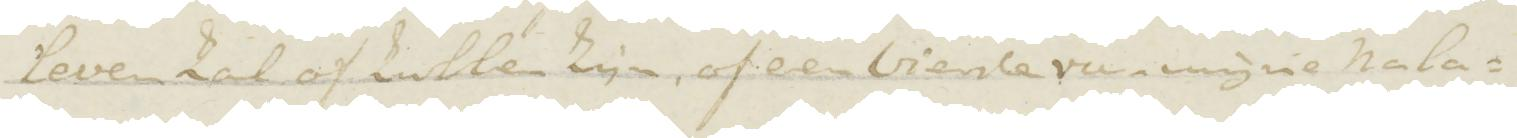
leven Zal of Zullen Zijn, of een vierde van mijne nala=
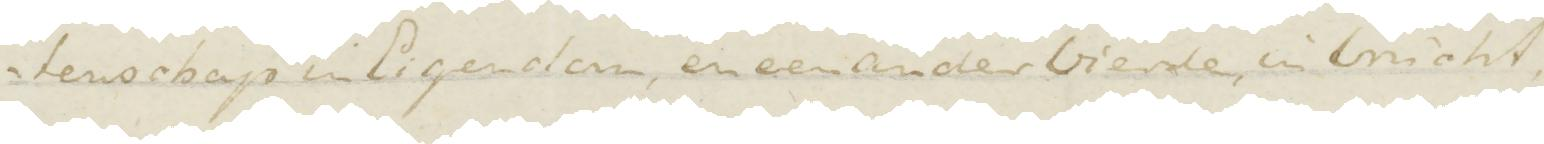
-tenschap in Eigendom, en een ander vierde, in vrucht
